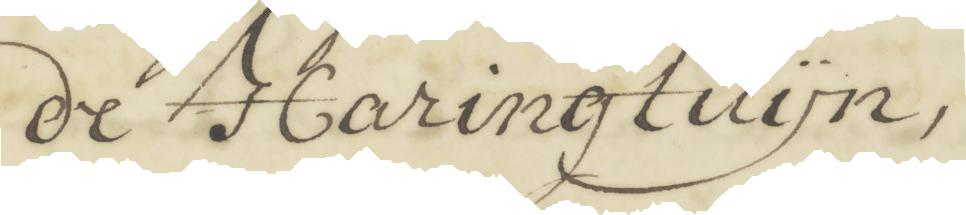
de Haringtuijn,
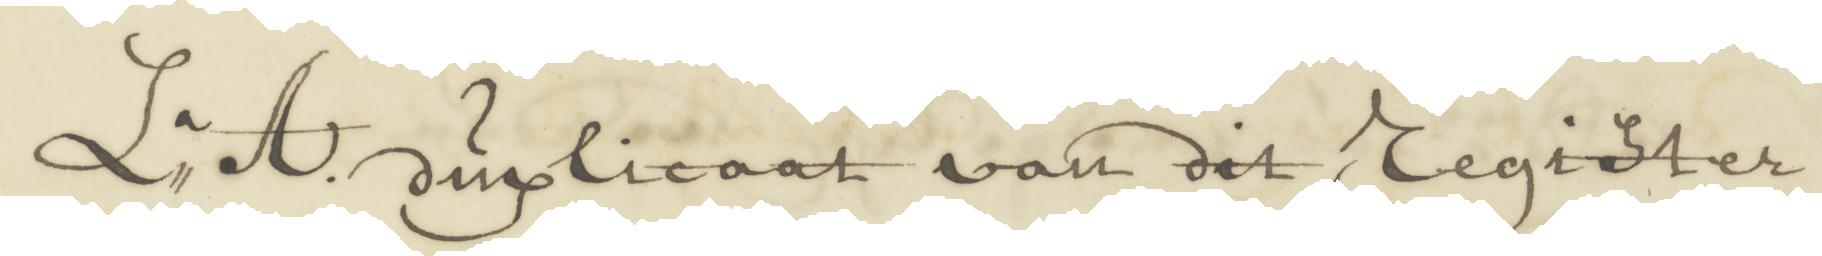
L„a A. duplicaat van dit Register
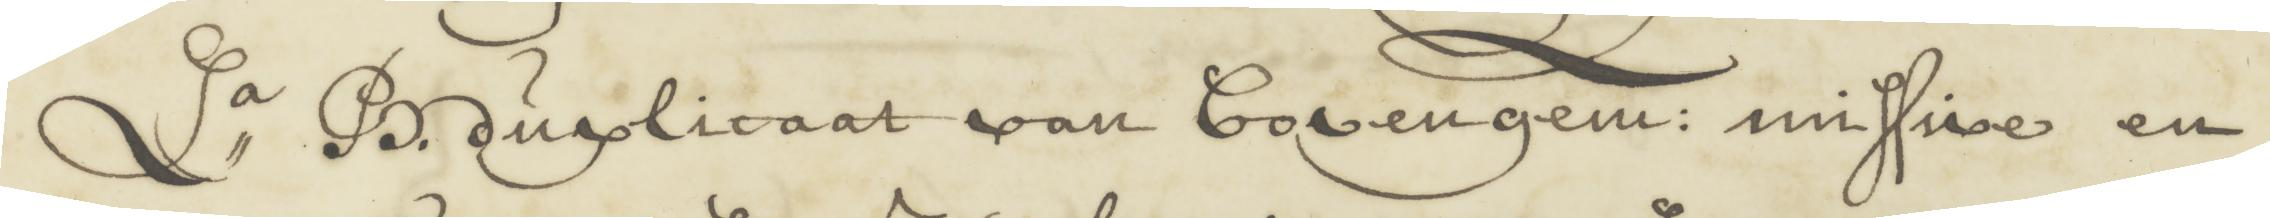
L„a B. duplicaat van bovengem: missive en
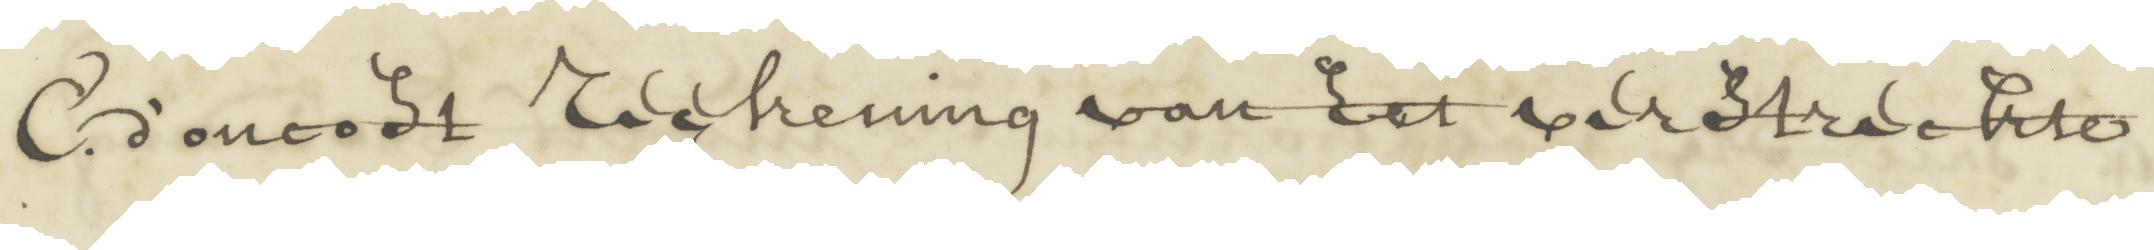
C. d’oncost Reekening van het verstreckte
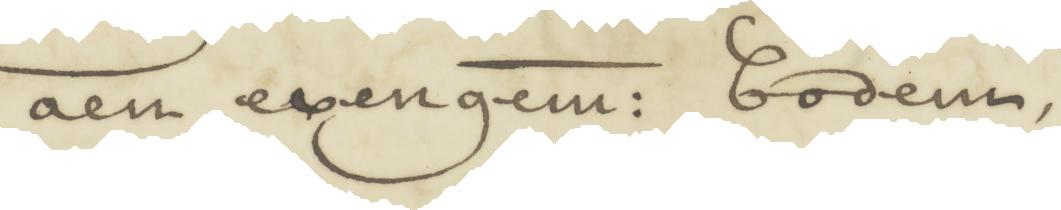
aen evengem: bodem,
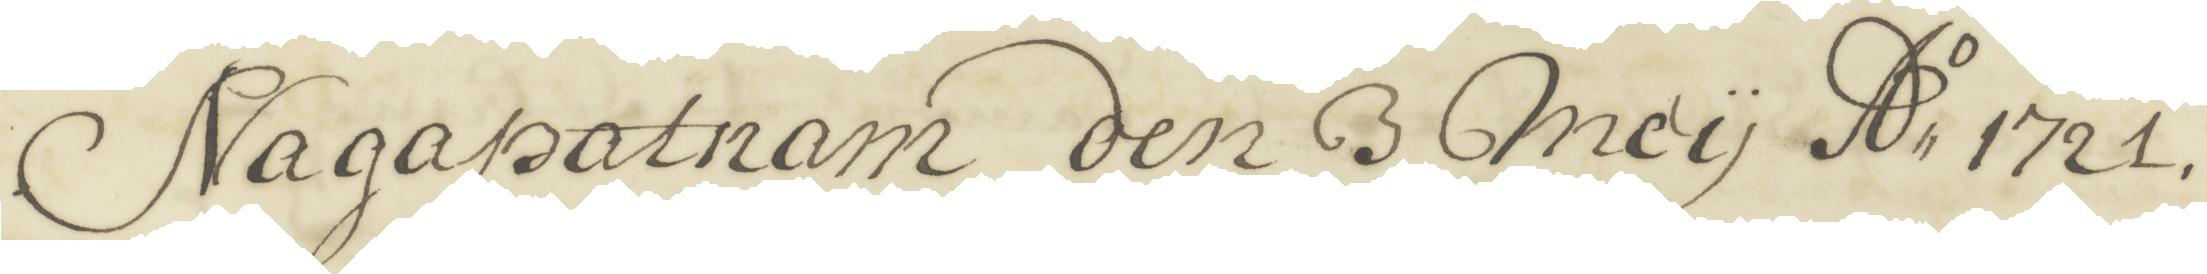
Nagapatnam den 3 Meij A„o 1721.
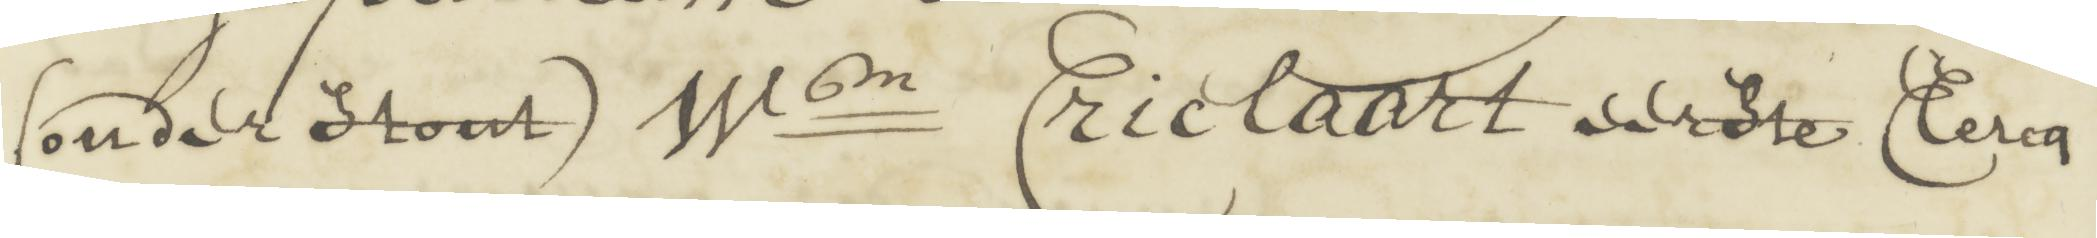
(onderstont) W=m Criclaart eerste Clercq
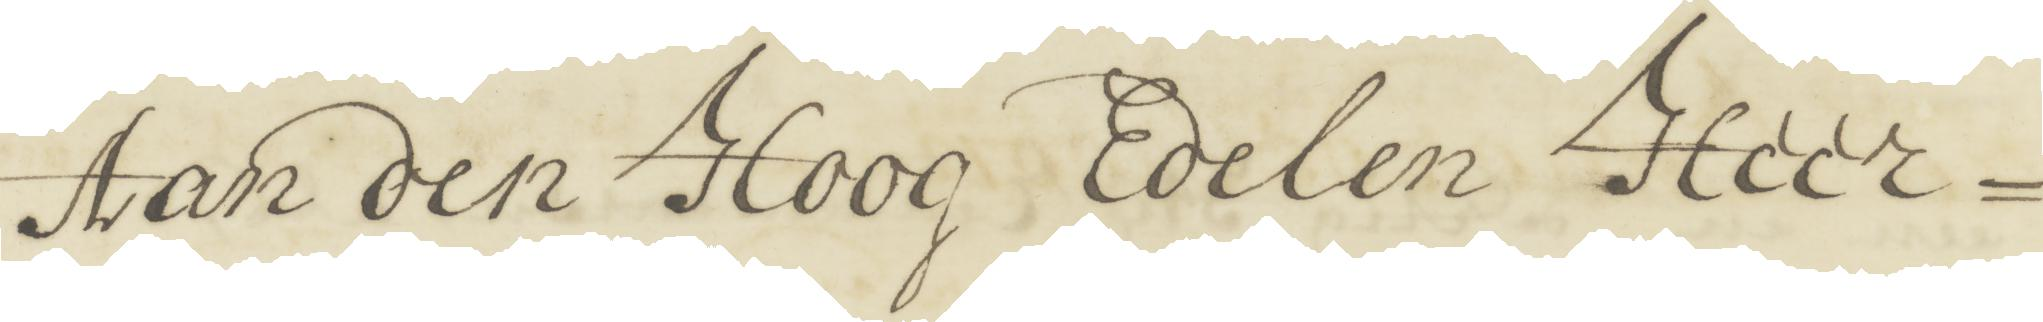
Aan den Hoog Edelen Heer =
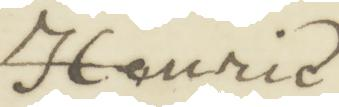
Henric
